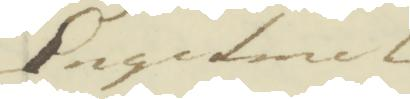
Engesmit
